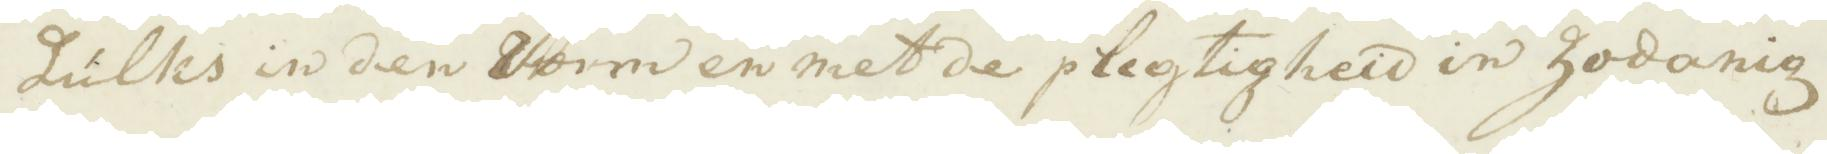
zulks in den Vorm en met de pligtigheid in zodanig
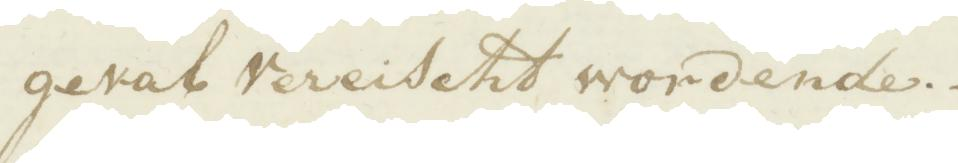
geval vereischt wordende.
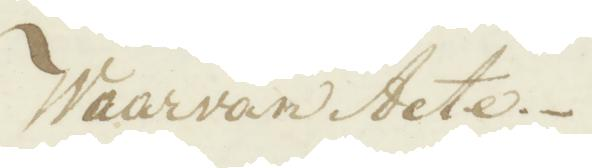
Waarvan Acte. –
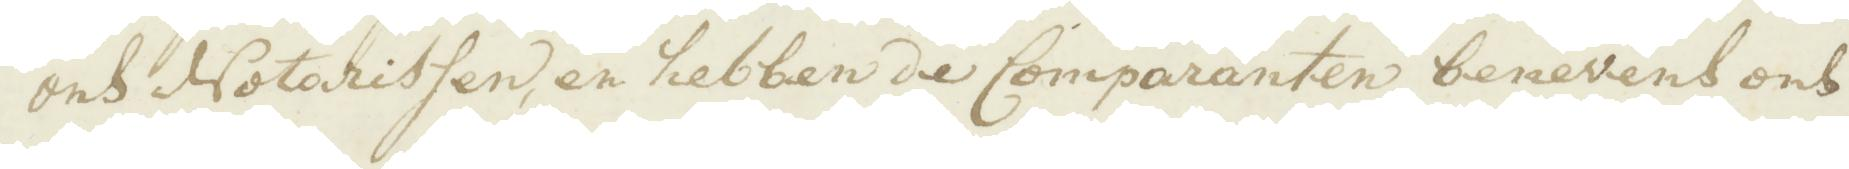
ons Notarissen, en hebben de Comparanten, benevens ons
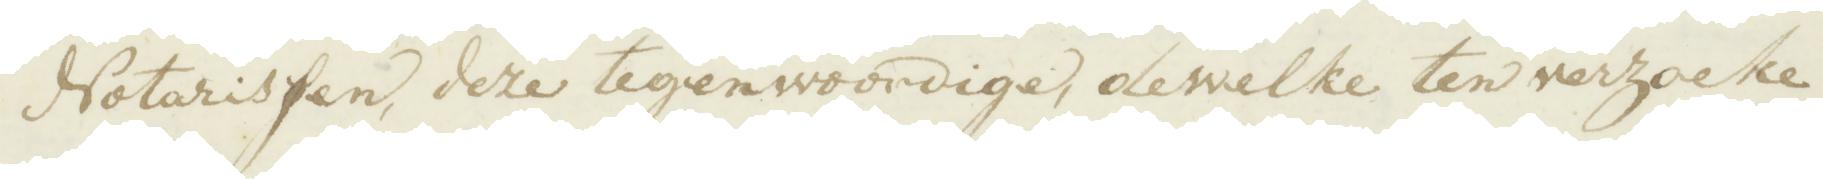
Notarissen, deze tegenwoordige, dewelke ten verzoeke
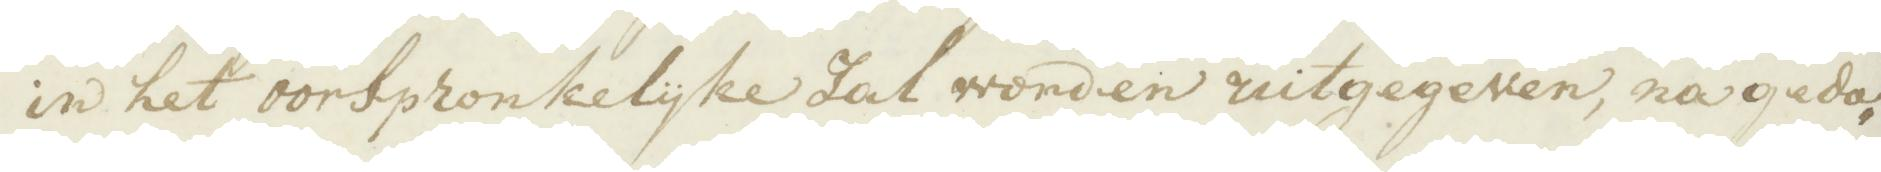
in het oorspronkelijke zal worden uitgegeven, na geda„
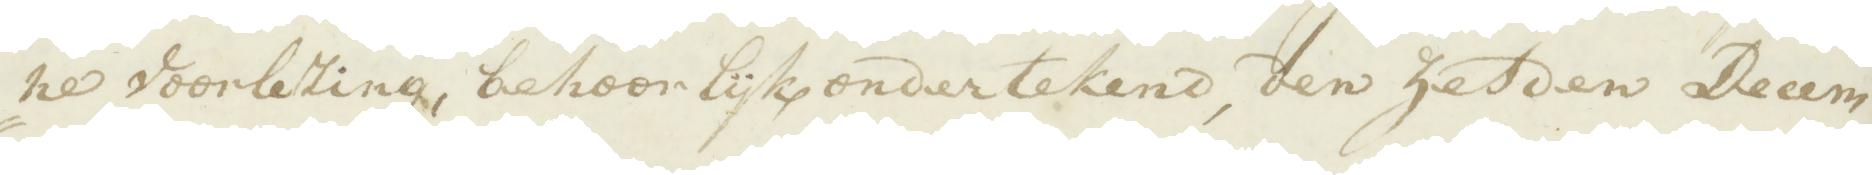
„ne voorlezing, behoorlijk ondertekend, den Zesden Decem
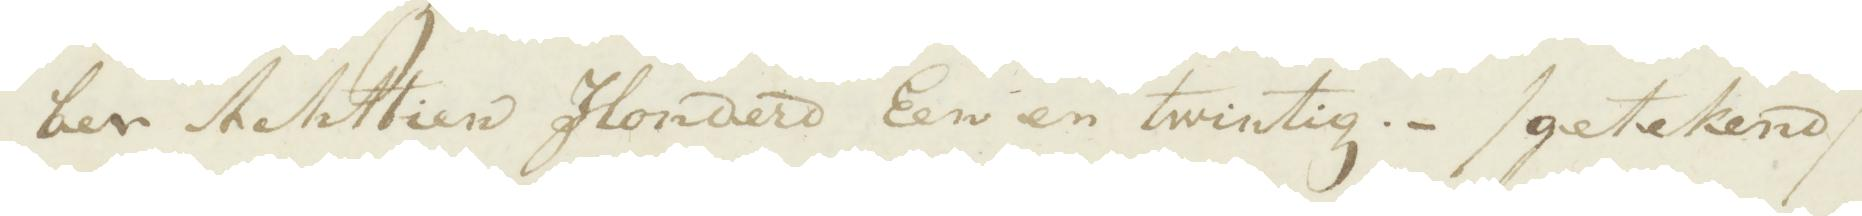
ber Achttien Honderd Een en twintig. - /getekend/
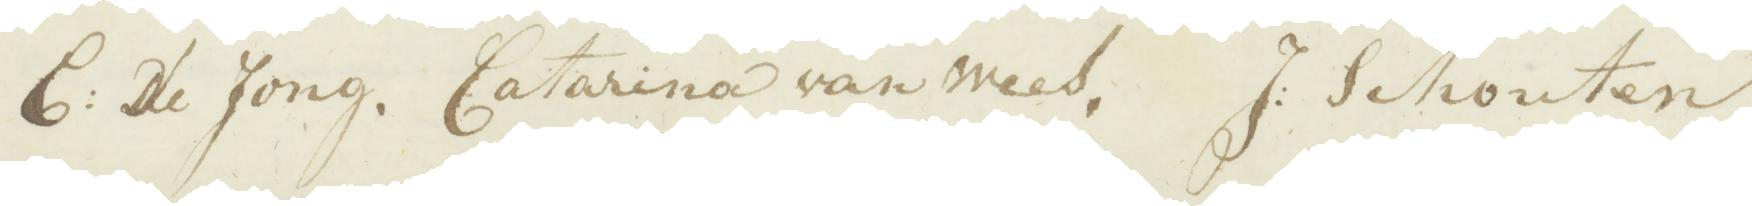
C: De Jong, Catarina van wees, J: Schouten
